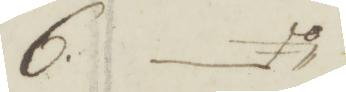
6. _„o
